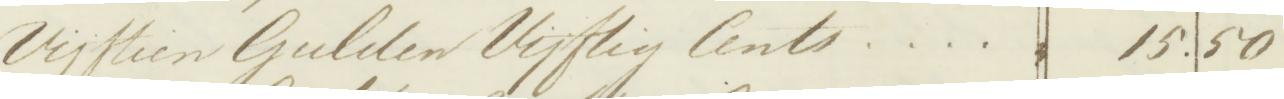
Vijftien Gulden Vijftig Cents . . . . „ 15.50
